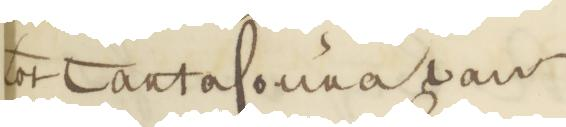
tot Cartasoura van
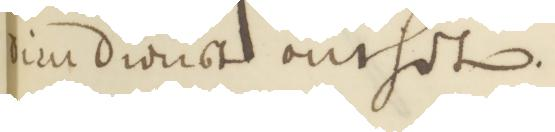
dien dienst ontset.
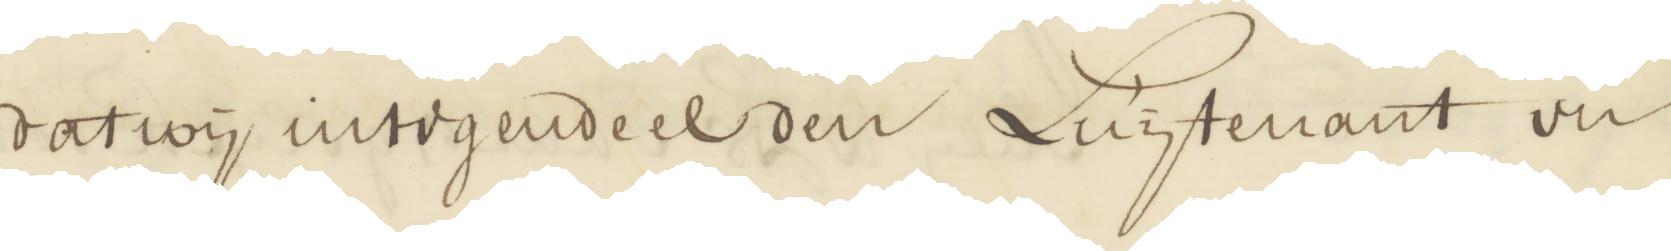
dat wij integendeel den Luijtemant en
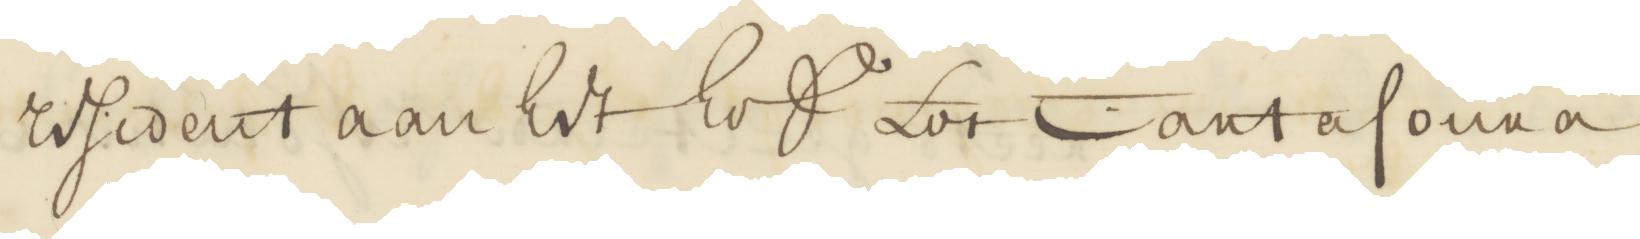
resident aan het hof tot Cartasoura
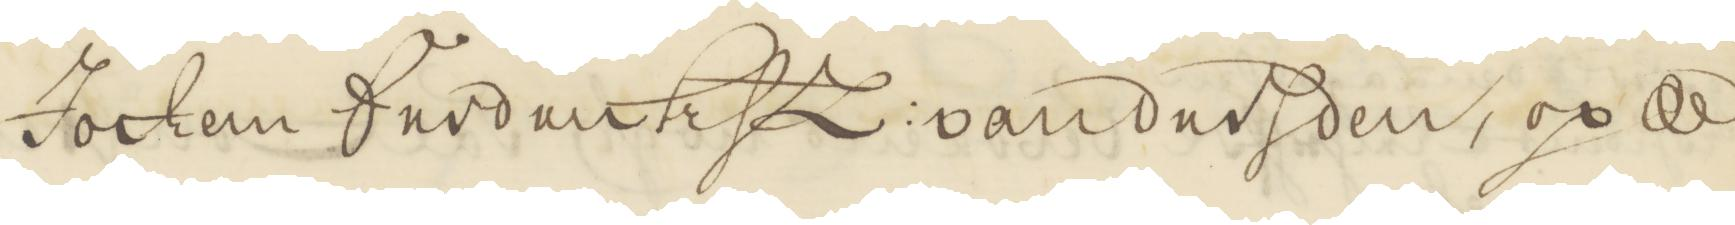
Jochem Fredricksz: van dresden, op de
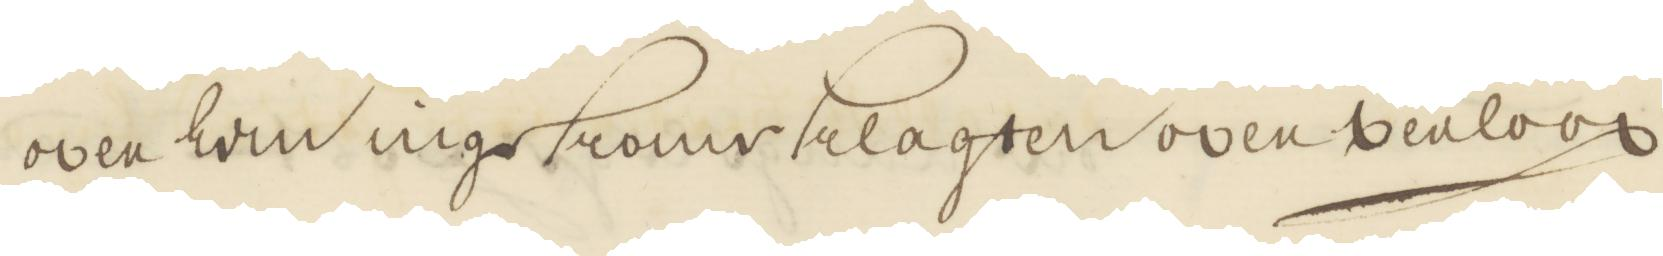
over hem ingekome klagten over verloop
